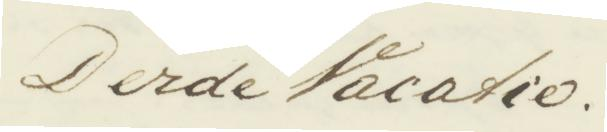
Derde Vacatie.
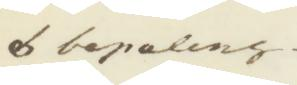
¶ bepaling.
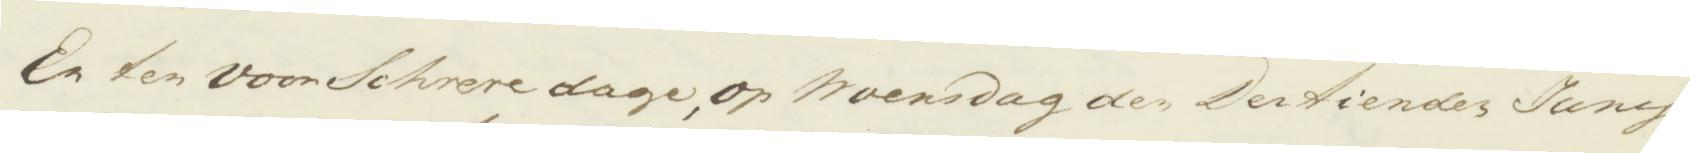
En ten voorschreve dage, op Woensdag den Dertienden Iuny
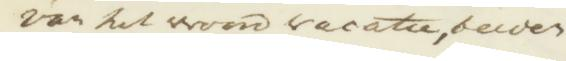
van het woord vacatie, beiden
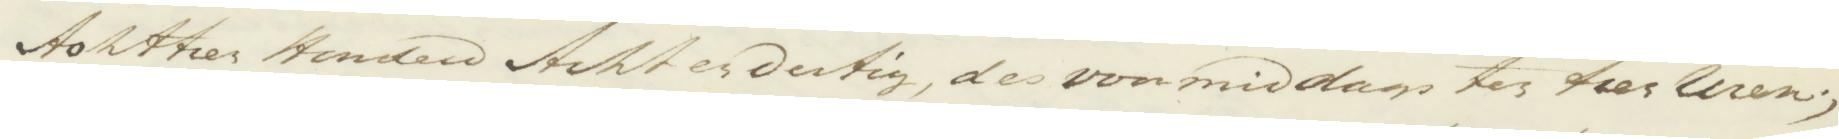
Achttien Honderd Acht en dertig, des voormiddags ten tien Uren;
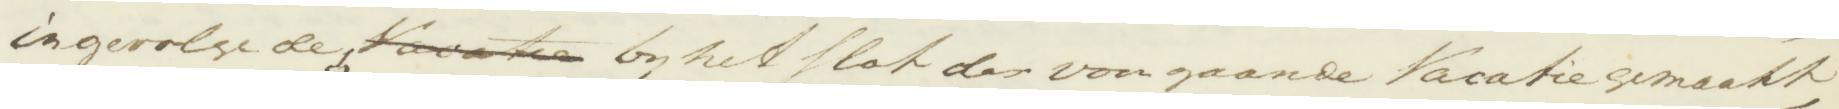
in gevolge de ¶ Vacatie by het slot der voorgaande Vacatie gemaakt,
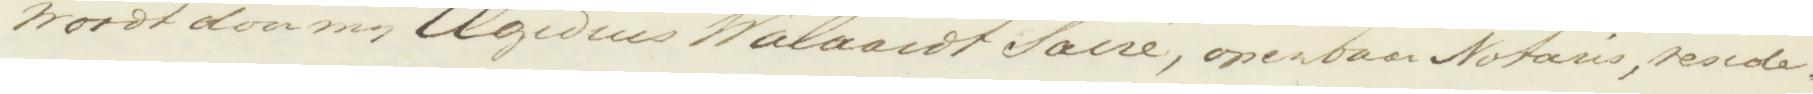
wordt door my AEgidius Walaardt Sacré, openbaar Notaris, reside
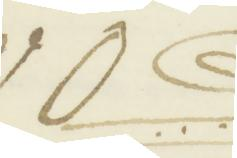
J V O
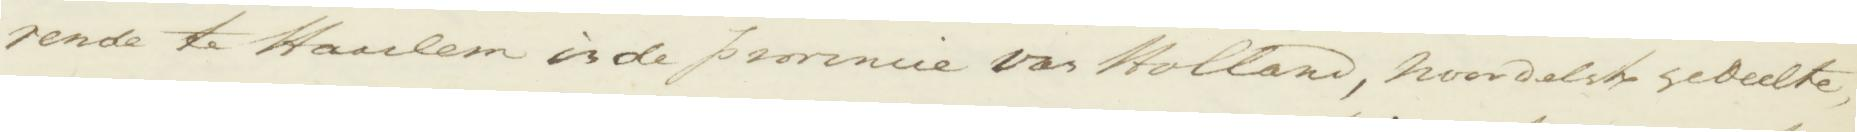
rende te Haarlem in de provincie van Holland, noordelyk gedeelte,
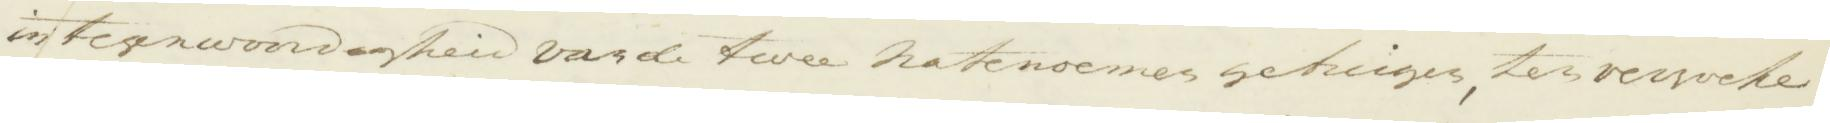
in tegenwoordigheid van de twee natenoemen getuigen, ten verzoeke
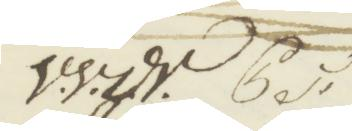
V.V.D.V. P F
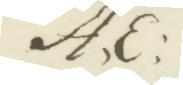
A,E:
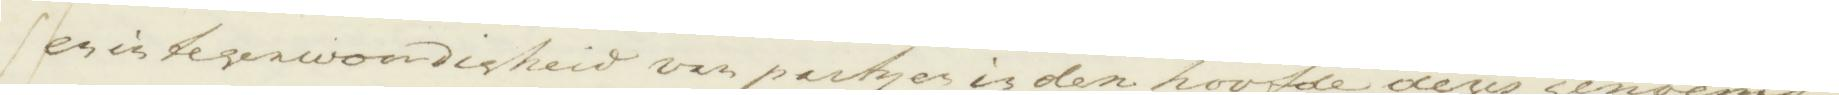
en in tegenwoordigheid van partyen is den hoofde dezes genoemd
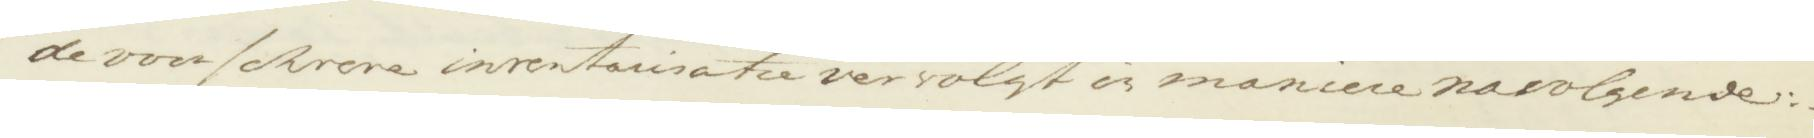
de voorschreve inventerisatie vervolgt in maniere navolgende:
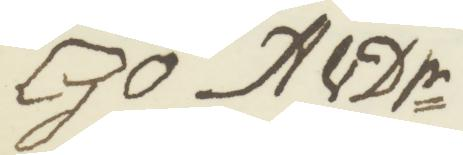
GO AVD j=r
